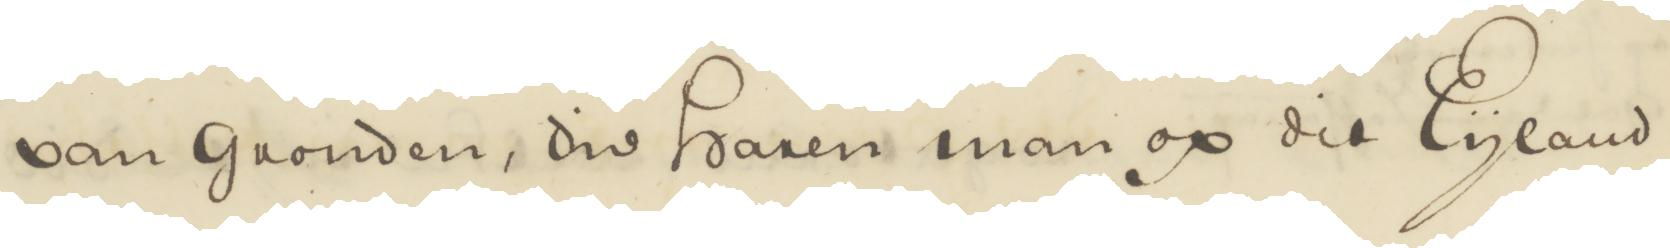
van gronden, die Haren man op dit Eijland
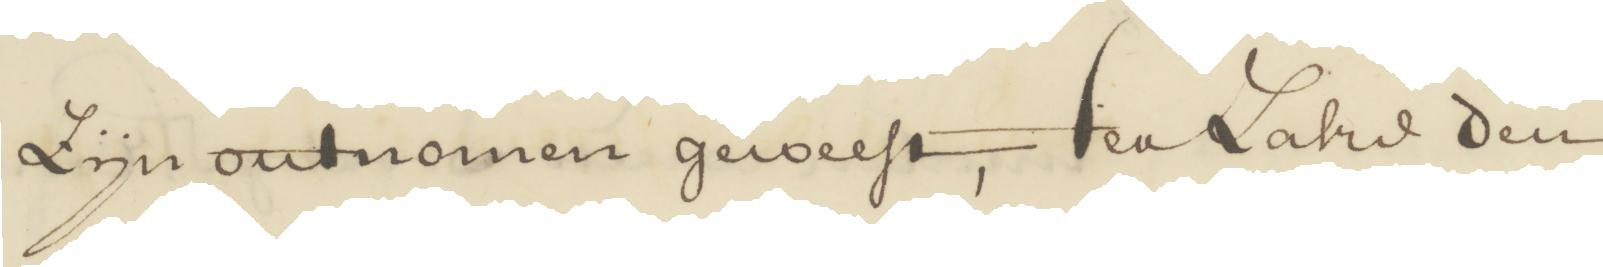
zijn ontnomen geweest, ter Zake den
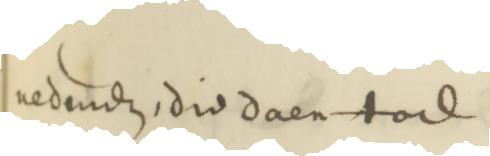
redenen, die daer toe
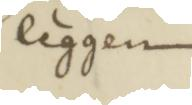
leggen
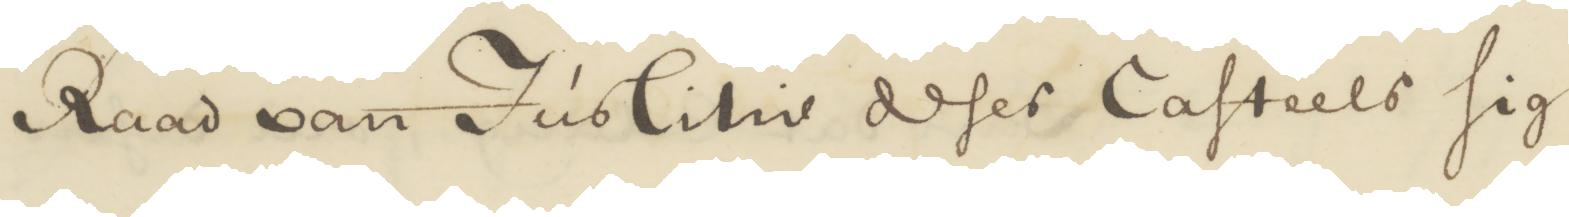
Raad van Justitie deses Casteels sig
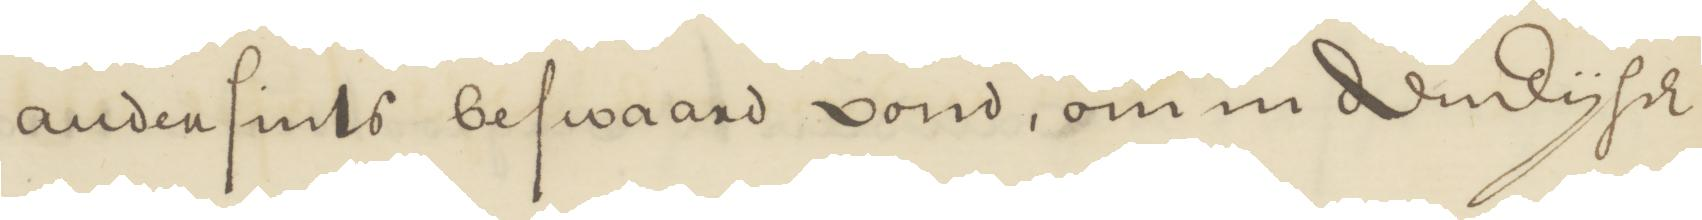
andersints beswaard vond, om in den Eijsch
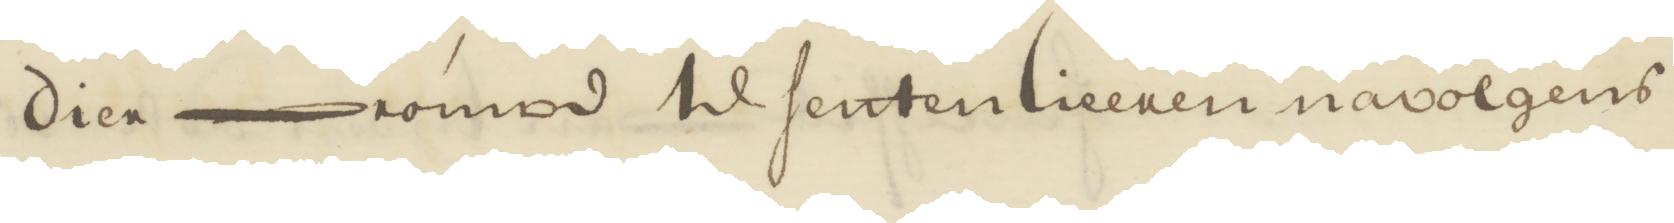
dier vrouwe te sententieeren navolgens
